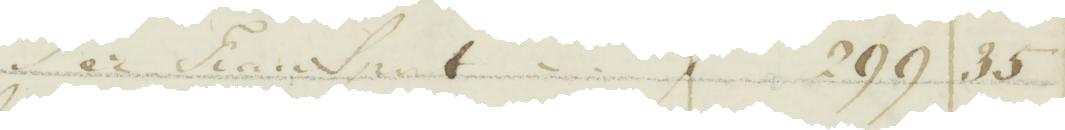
Per Transport - - ƒ 299 35
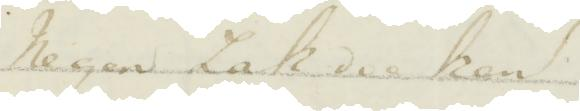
Negen Zak doeken
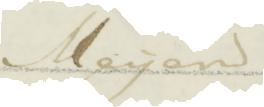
Meijers
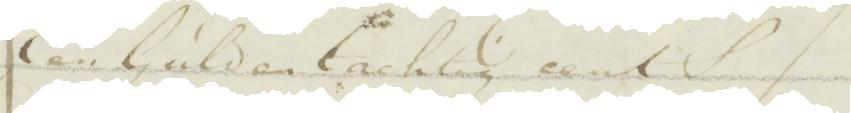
Een Gulden tachtig cents
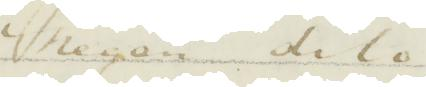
Negen dito
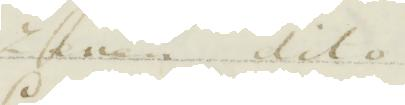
Zeven dito
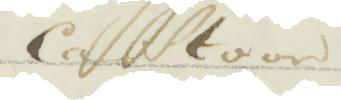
Castoor
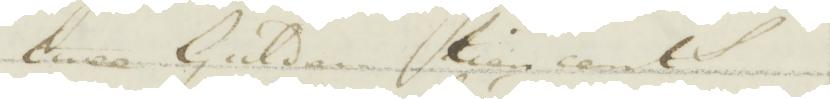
twee Gulden tien cents
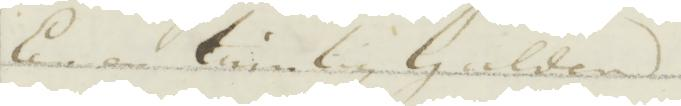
Een en twintig Gulden
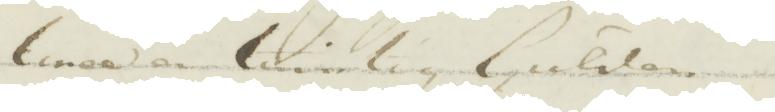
twee en twintig Gulden
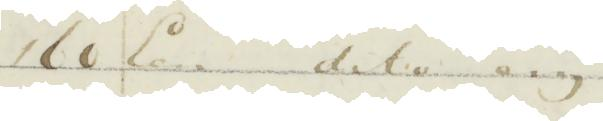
160 Een dito enz
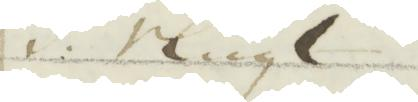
I: Vlugt
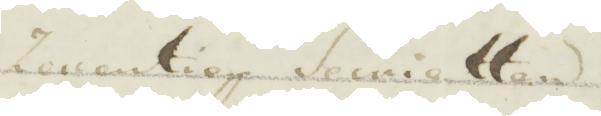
Zeventien Servietten
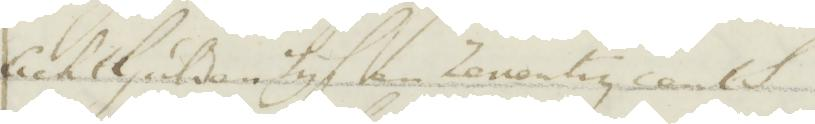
acht Gulden vijf van zeventig cents
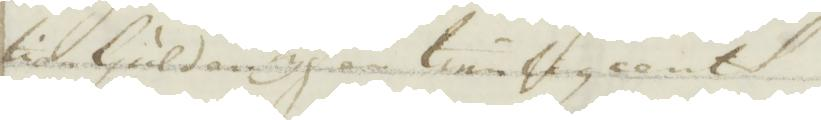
tien Gulden vijf en twintig cents
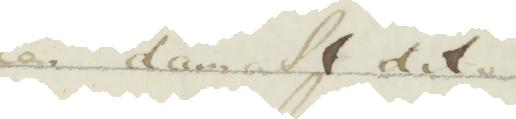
Een damast dito
